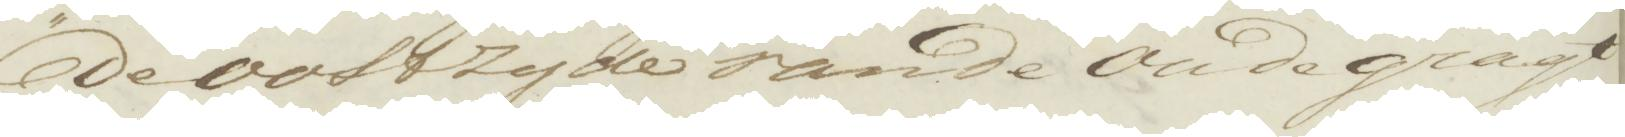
„de oostzyde van de oude gragt
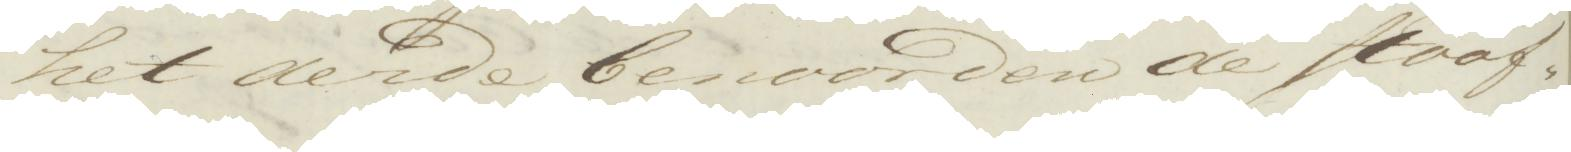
het derde benoorden de stoof„
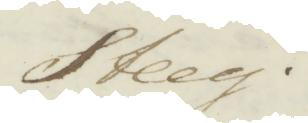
steeg.
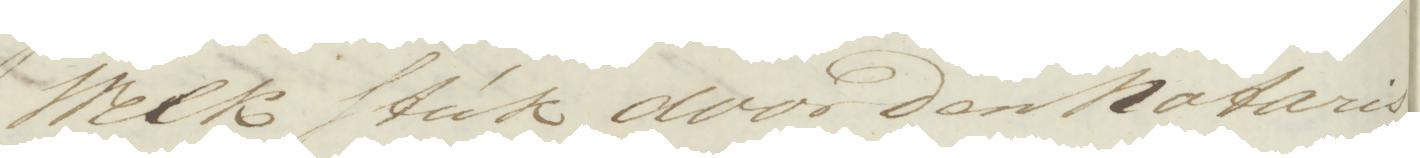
welk stuk door den notaris
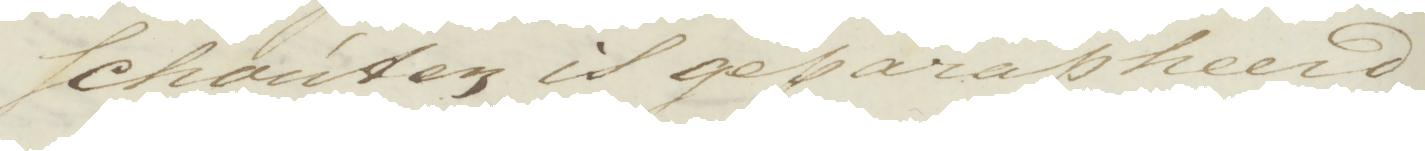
schouten is geparapheerd
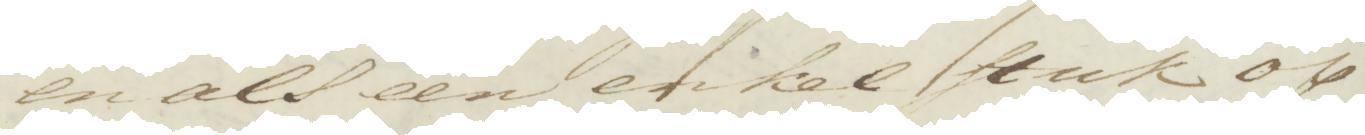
en als een enkel stuk op
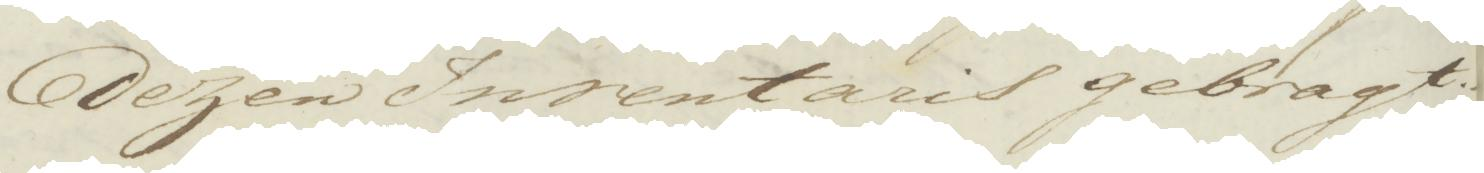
dezen Inventaris gebragt.
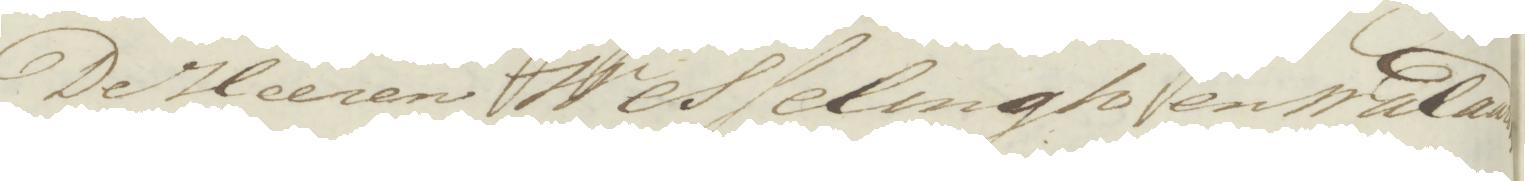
De Heeren Wesselingh en walan
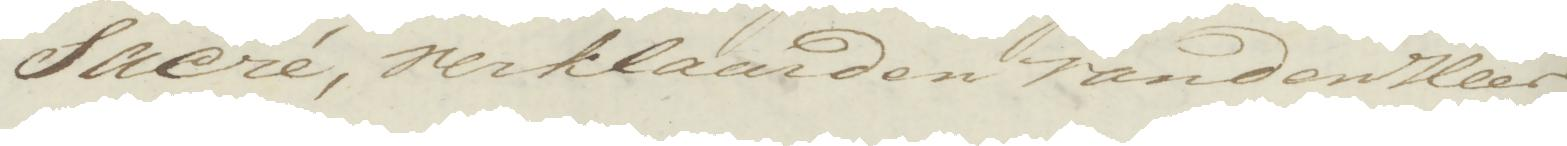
Sacré, verklaarden van den Heer
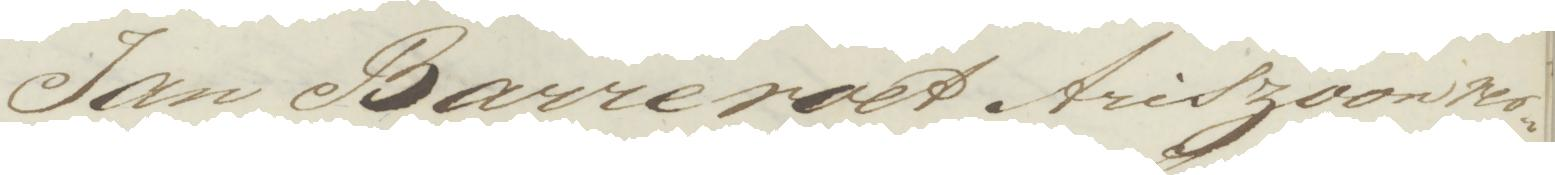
Jan Barrevoet Ariszoon ver„
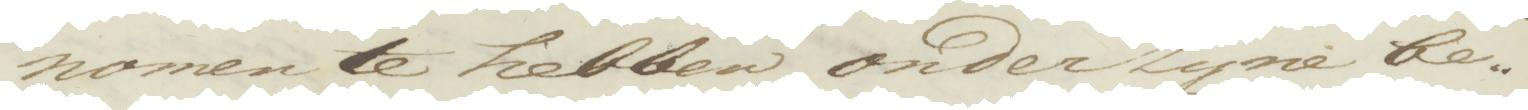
nomen te hebben onder zyne be„
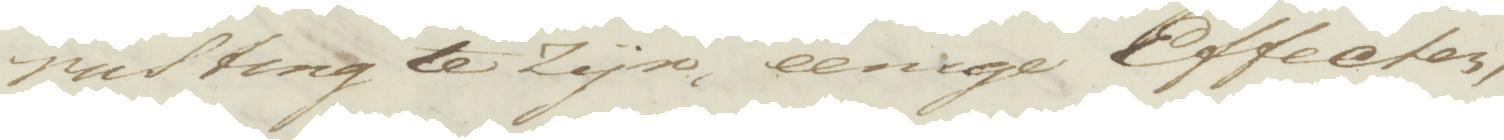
rusting te zijn, eenige Effecten,
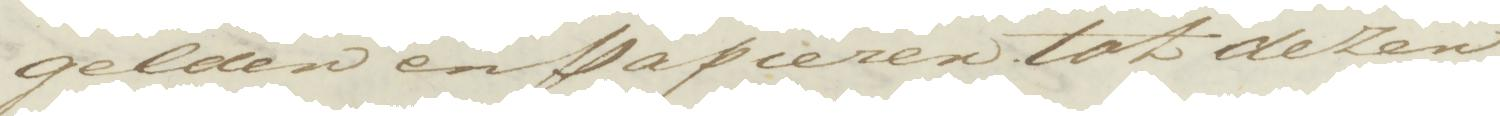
gelden en papieren tot dezen
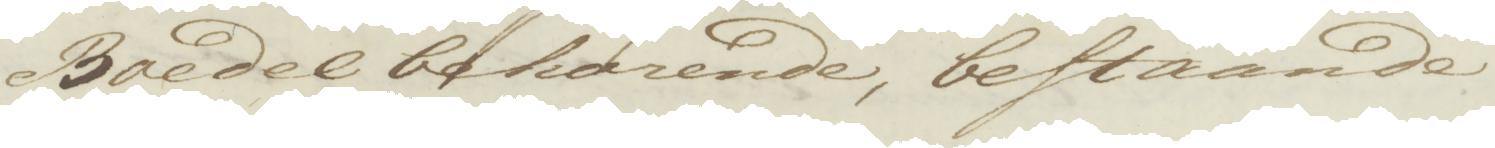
Boedel behorende, bestaande
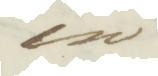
in
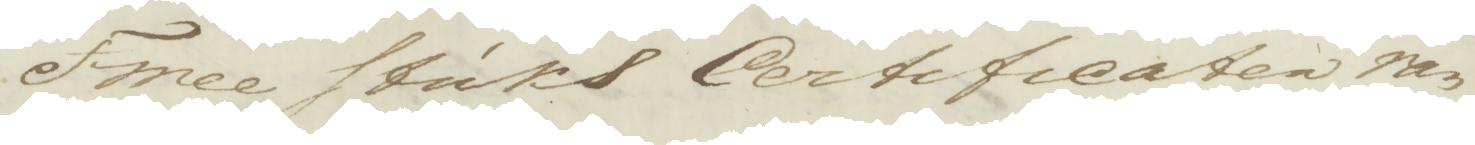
Twee stuks Certificaten van
